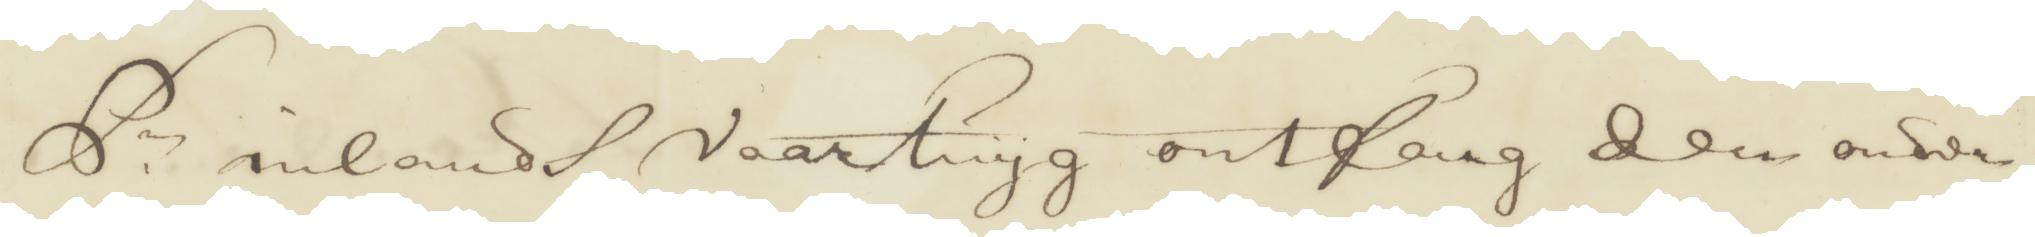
P.r inlands vaartuijg ontfang den onder
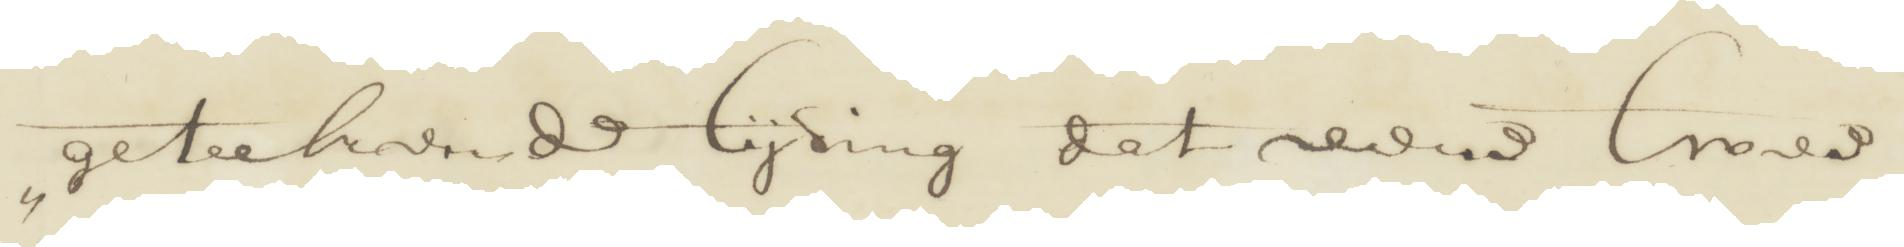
„geteekende tijding dat eene twee
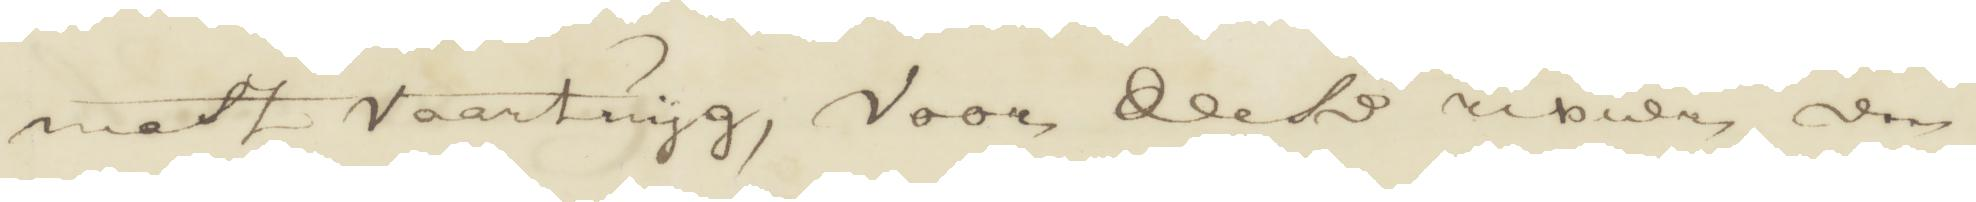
mast vaartuijg, voor deese rivier, en
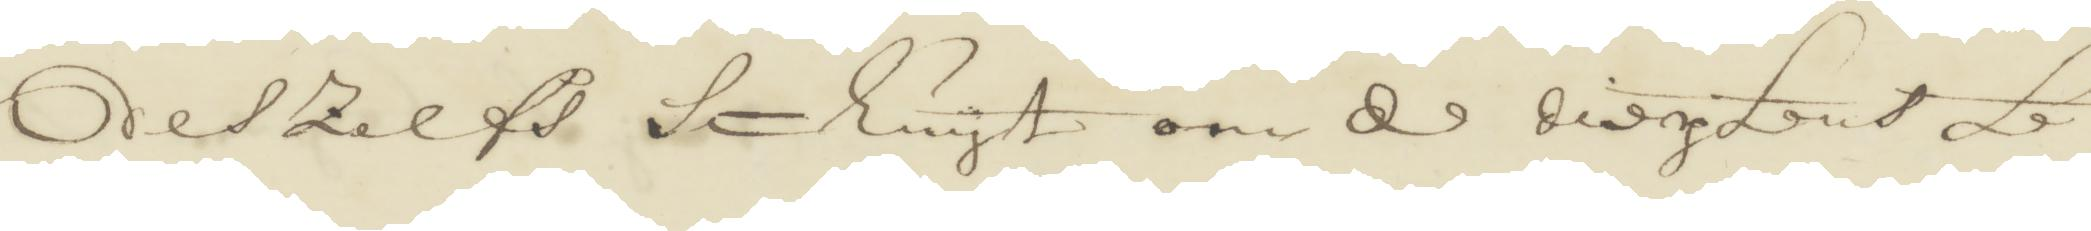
deszelfs schuijt om de dieptens te
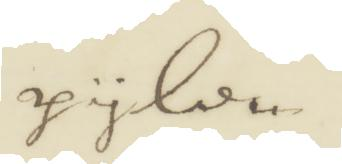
pijlen.
